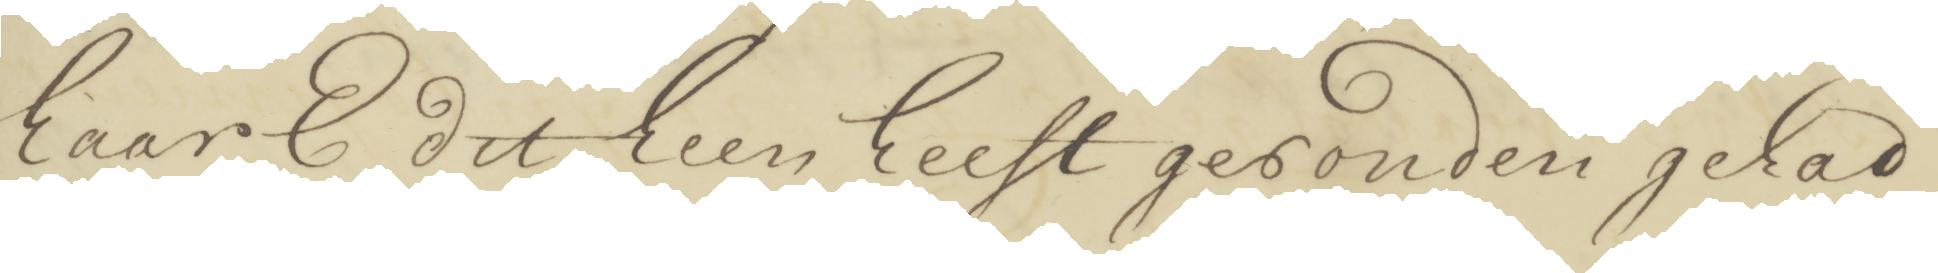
haar E dit heen heeft gesonden gehad
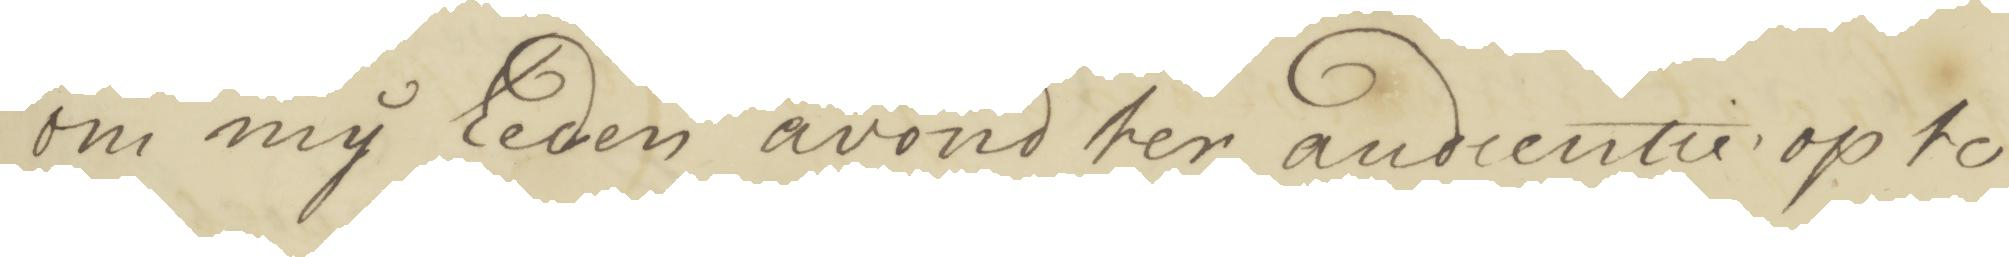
om mij heden avond ter audientie op te
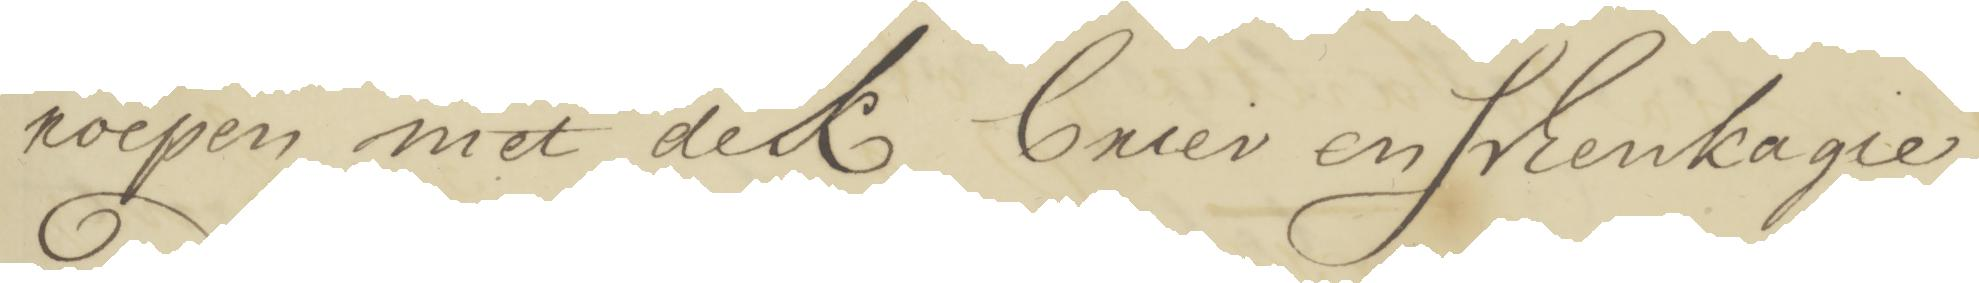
roepen met de K briev en Schenkagie
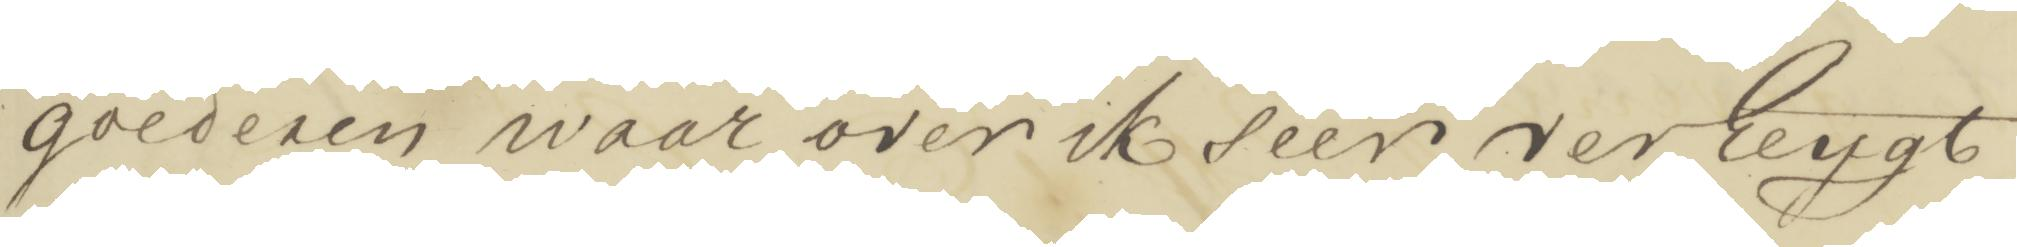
goederen waar over ik seer verheygt
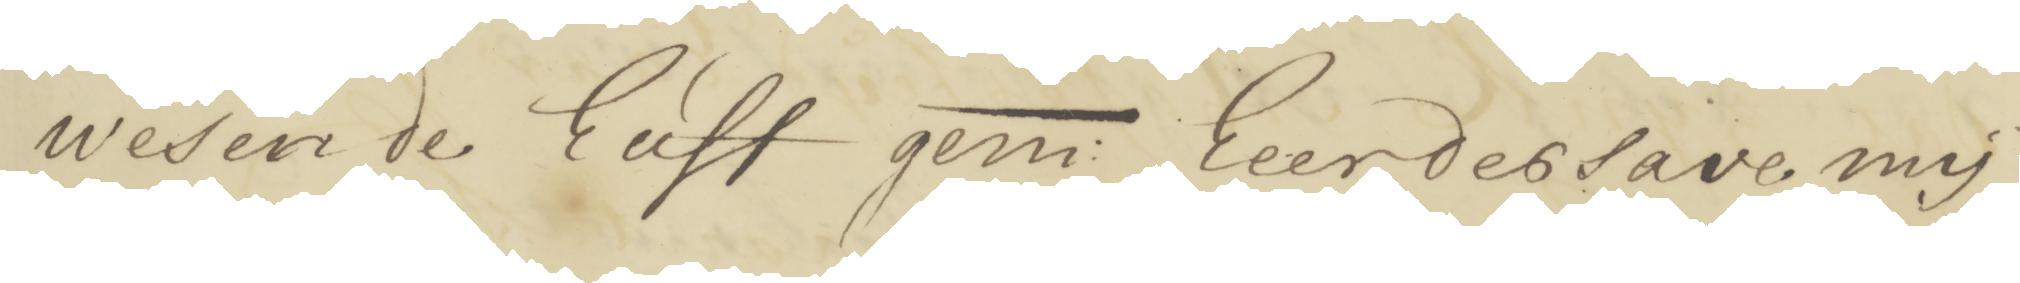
wesen de heeft gem: heer dessave mij
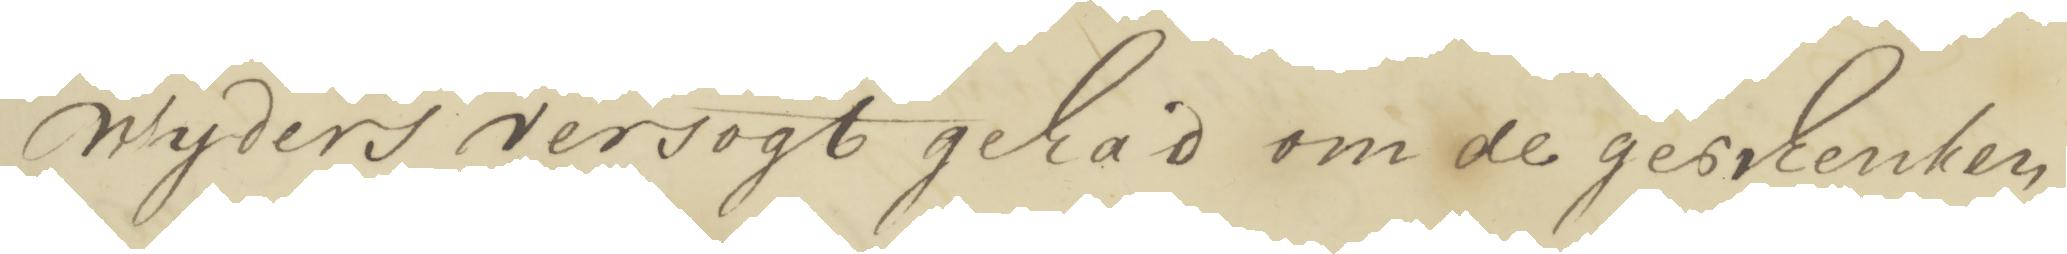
wyders versogt gehad om de geschenken
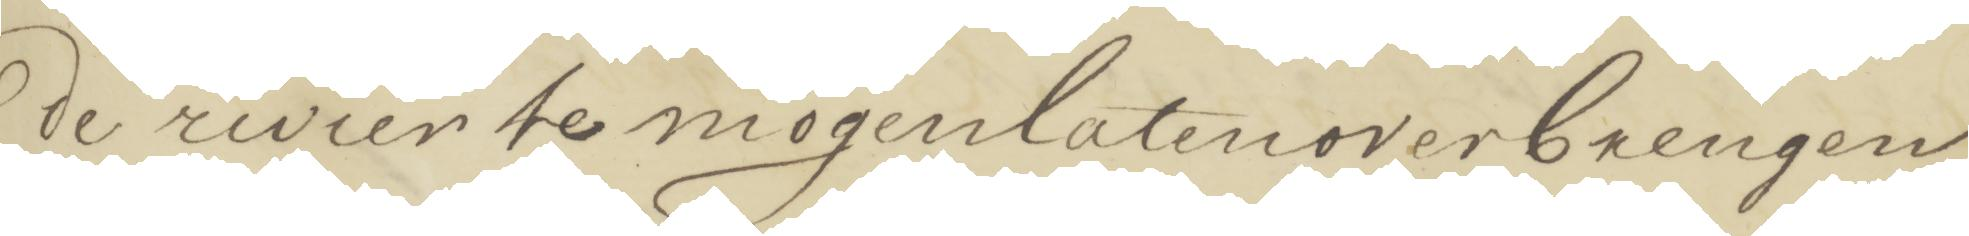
de revier te mogen laten overbrengen
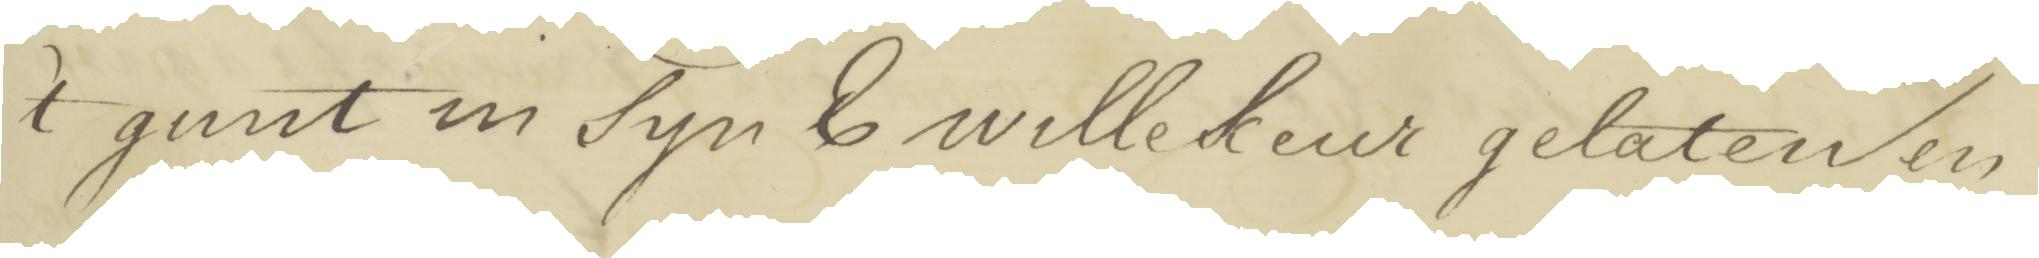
’t gunt in syn E willekeur gelaten en
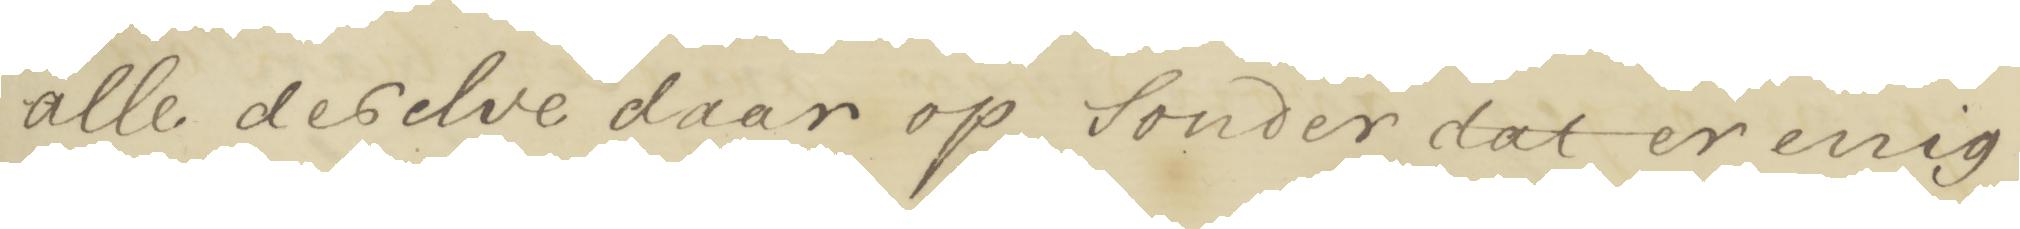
alle desclve daar op Sonder dat er enig
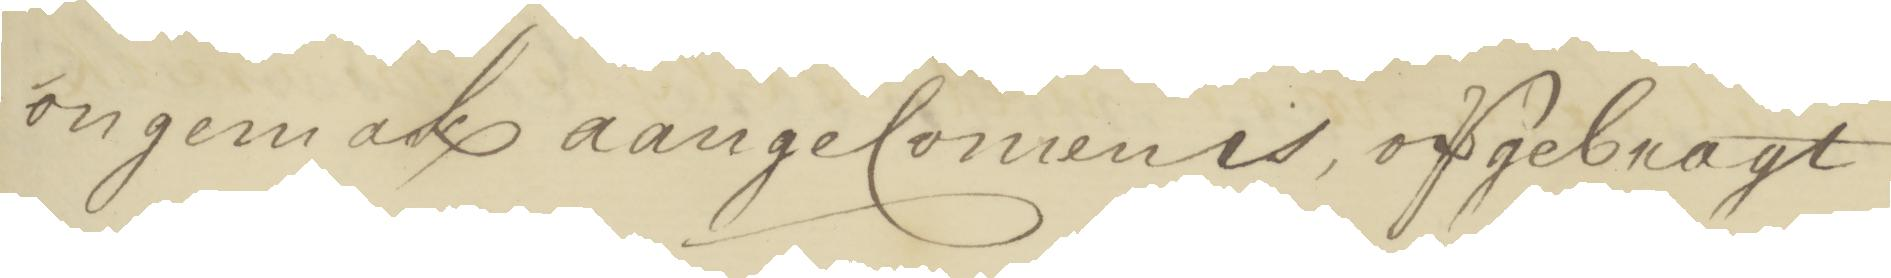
ongemak aangecomen is, overgebragt
